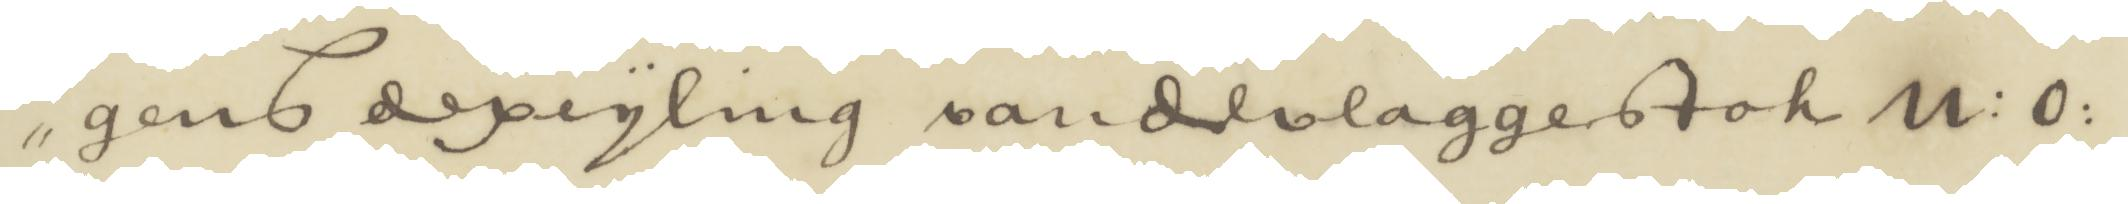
„gens depeijling van de vlaggestok 11: 0:
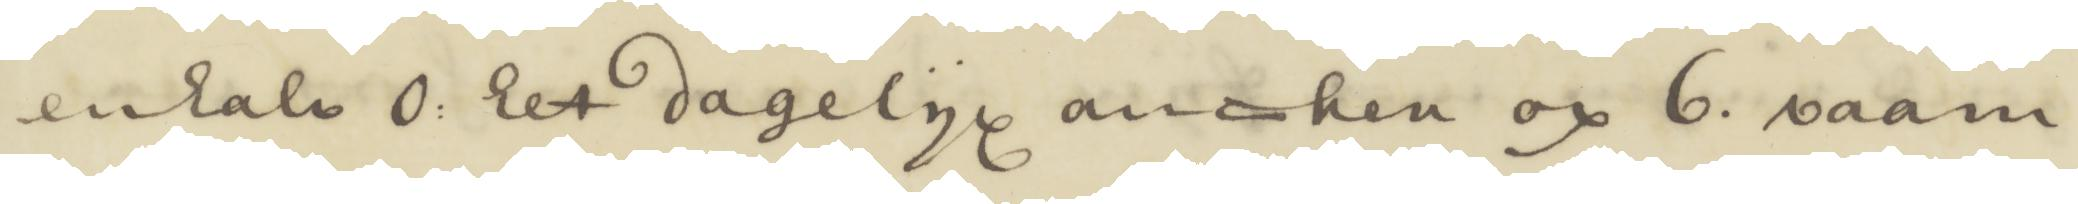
en halv 0: het dagelijx ancker op 6. vaam
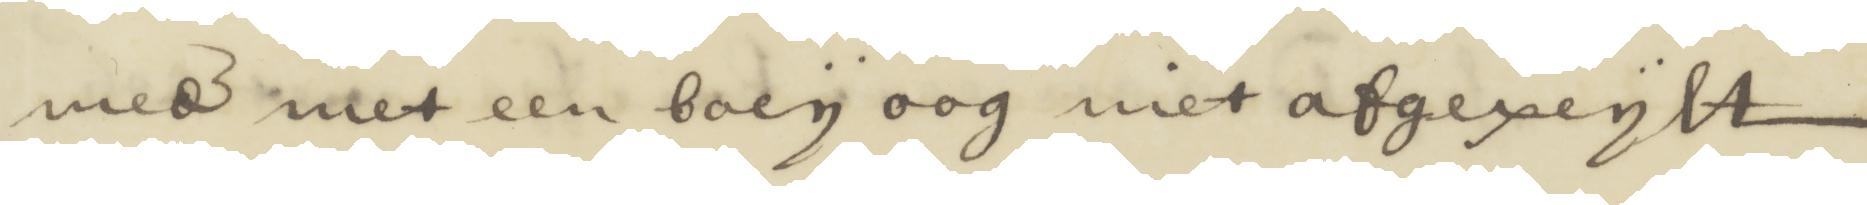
mede met een boeij oog niet afgepeijlt
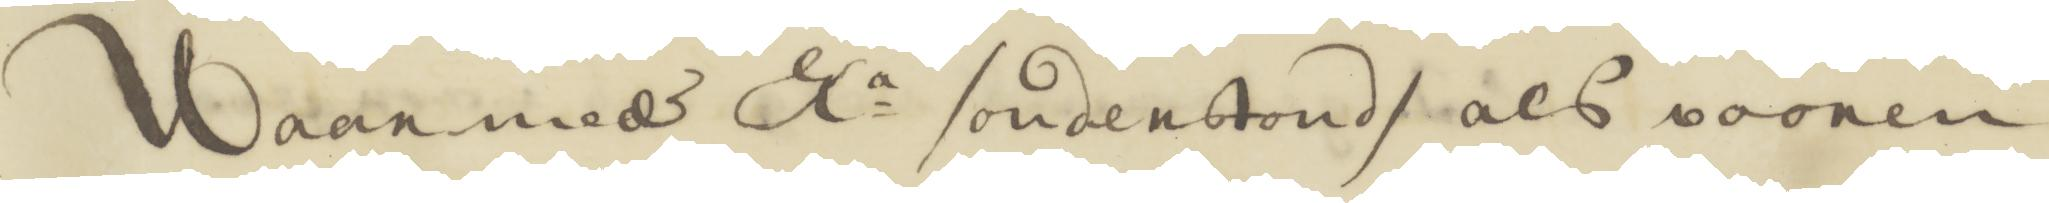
Waar mede &=a /onderstond/ als vooren
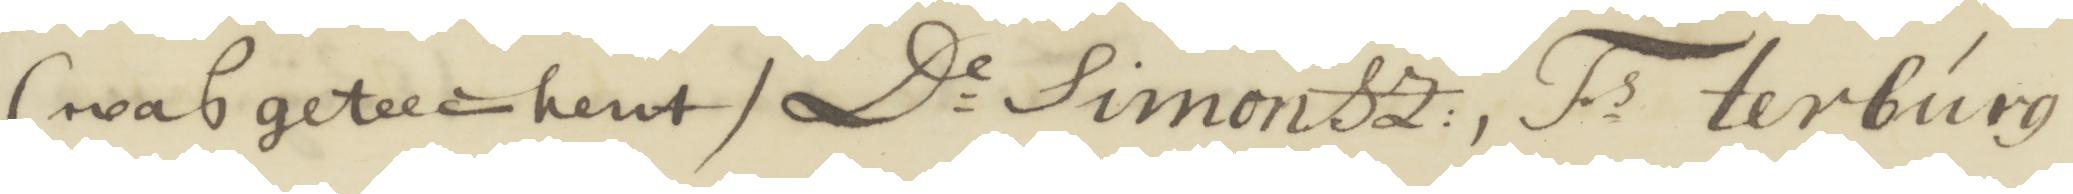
(was geteeckent/ D=e Simonsz:, F=s terburg
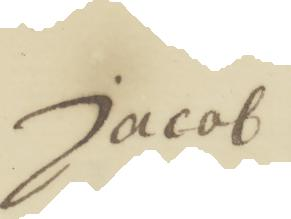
jacob
